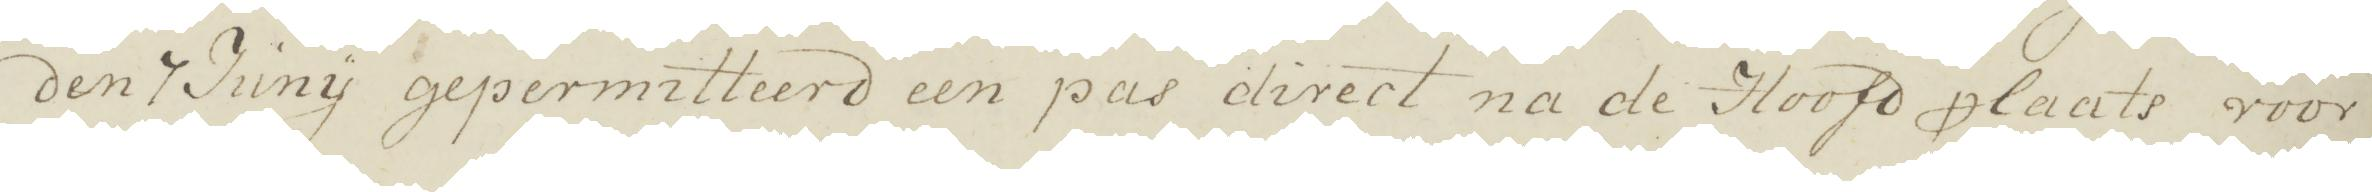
den 7 Iunij gepermitteerd een pas direct na de Hoofd plaats voor
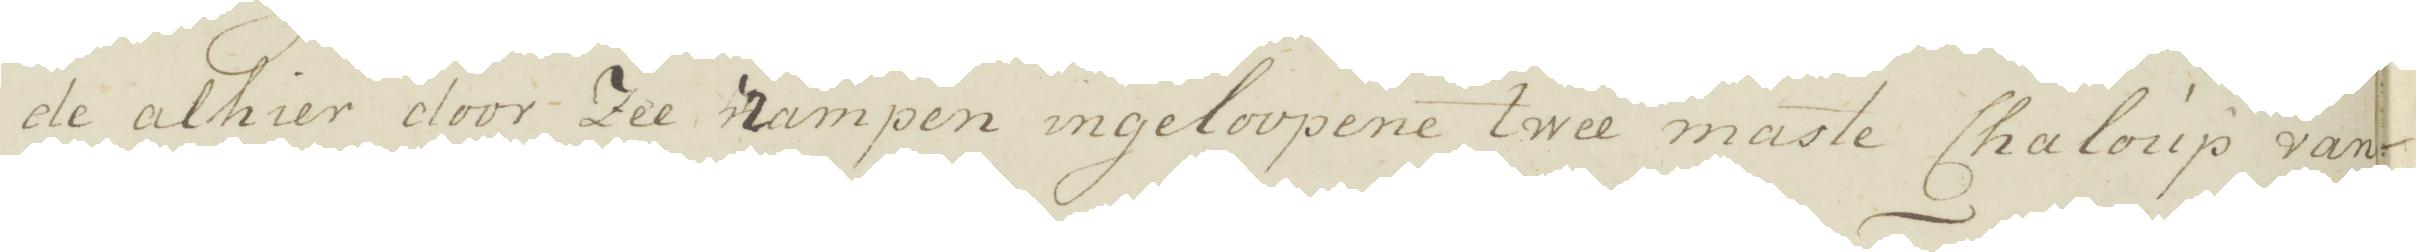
de alhier door Zee rampen ingeloopene twee maste Chaloup van
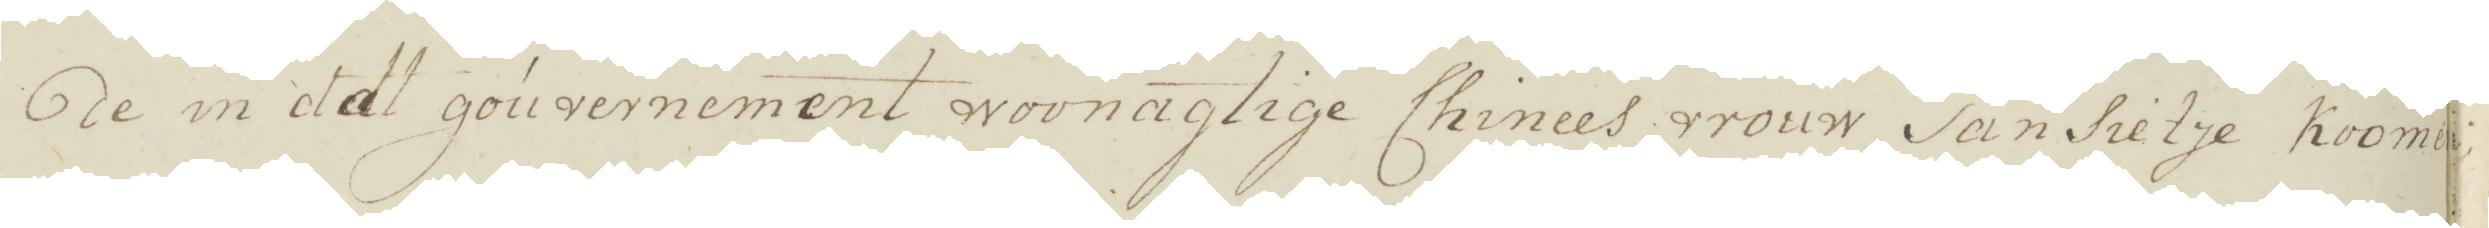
de in dat gouvernement woonagtige Chinees vrouw Tan Sie tje koomen„
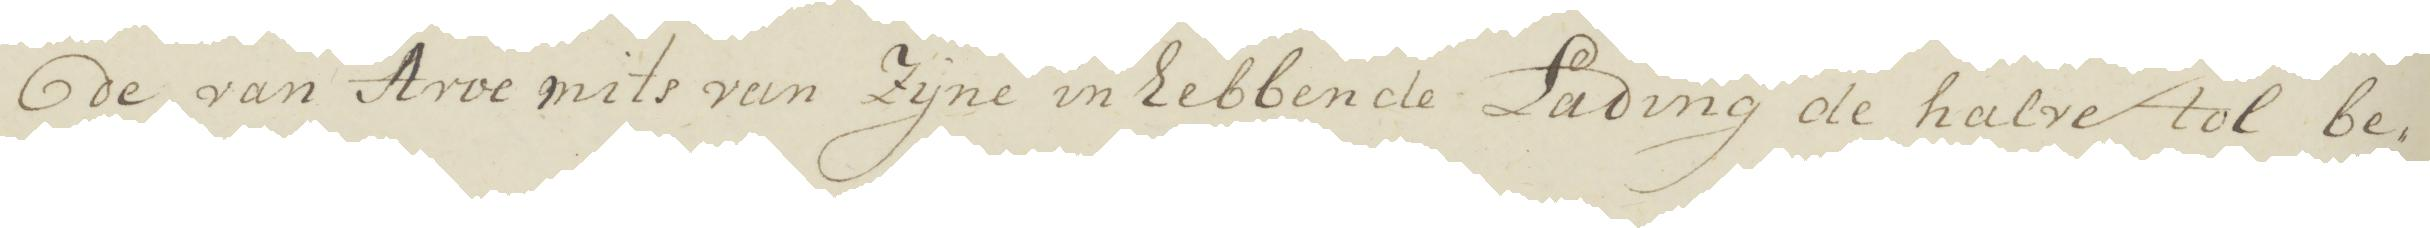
de van Aroe mits van Zijne in hebbende Lading de halve tol be„
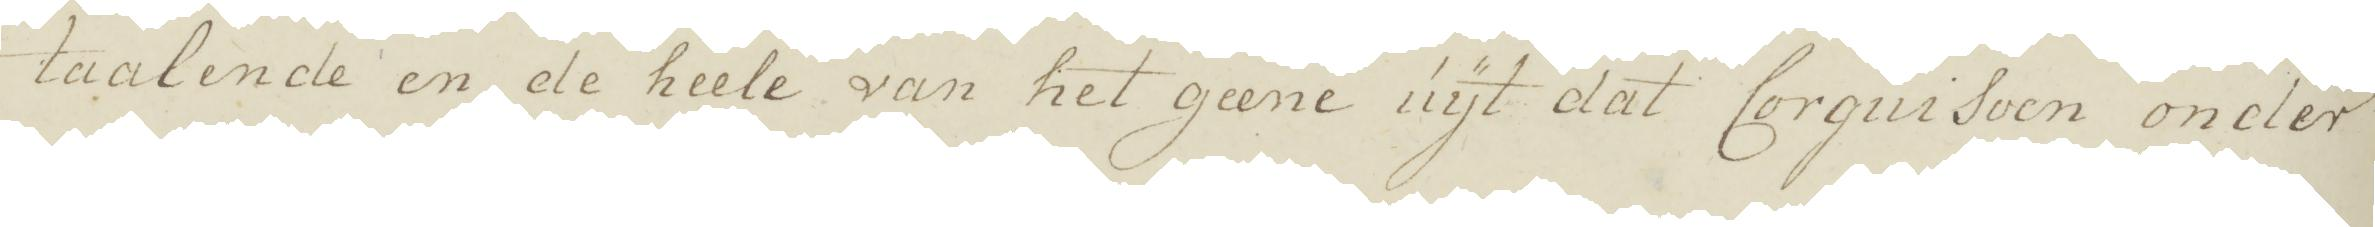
taalende en de heele van het geene uijt dat Corguisoen onder
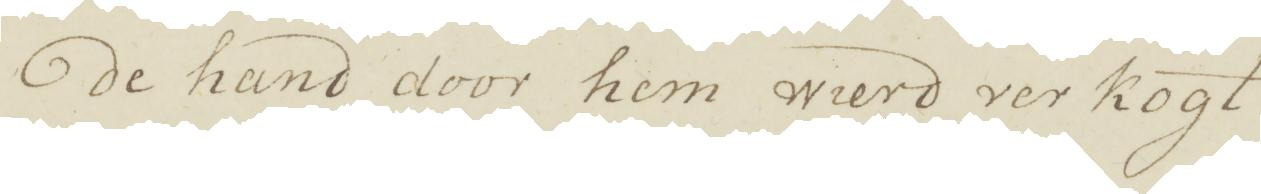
de hand door hem wierd ver kogt
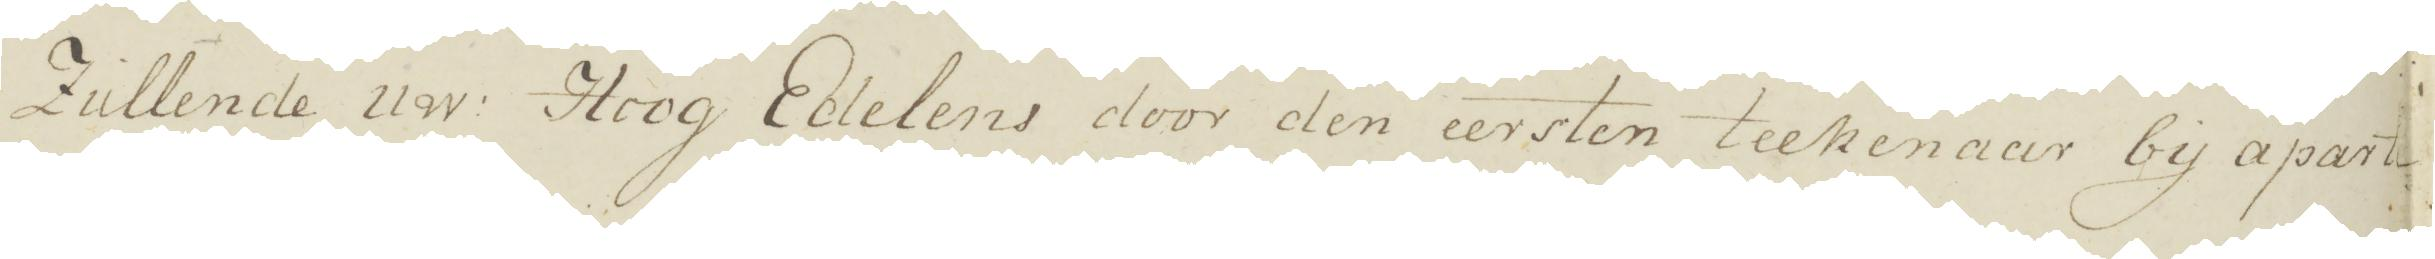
Zullende uw: Hoog Edelens door den eersten teekenaar bij apart
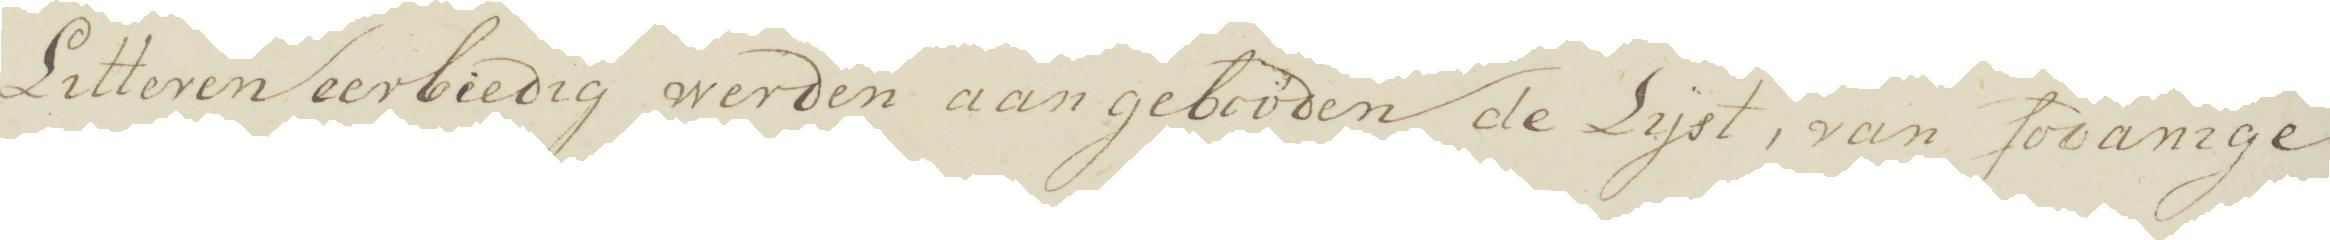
Litteren eerbiedig werden aan gebooden de Lijst, van Sodanige
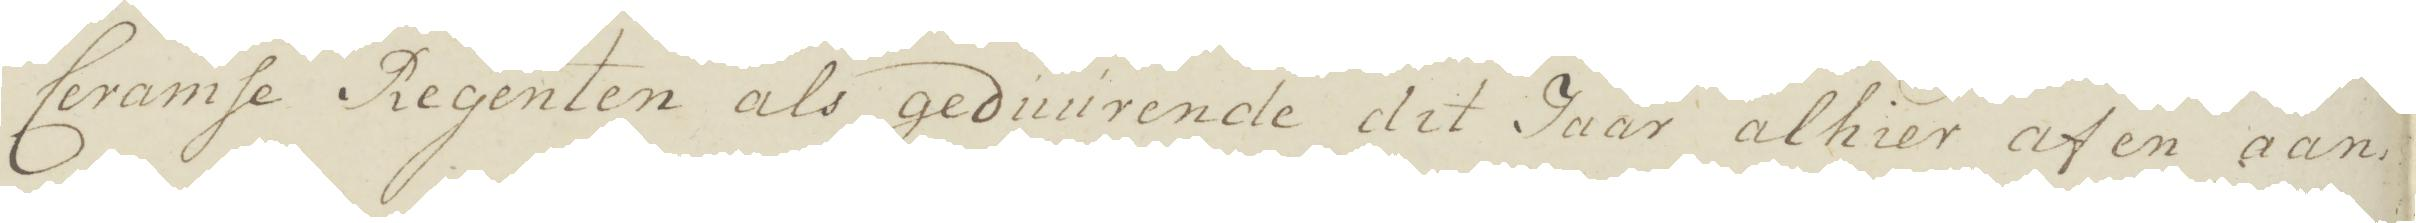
Ceramse Regenten als geduurende dit Iaar alhier af en aan,
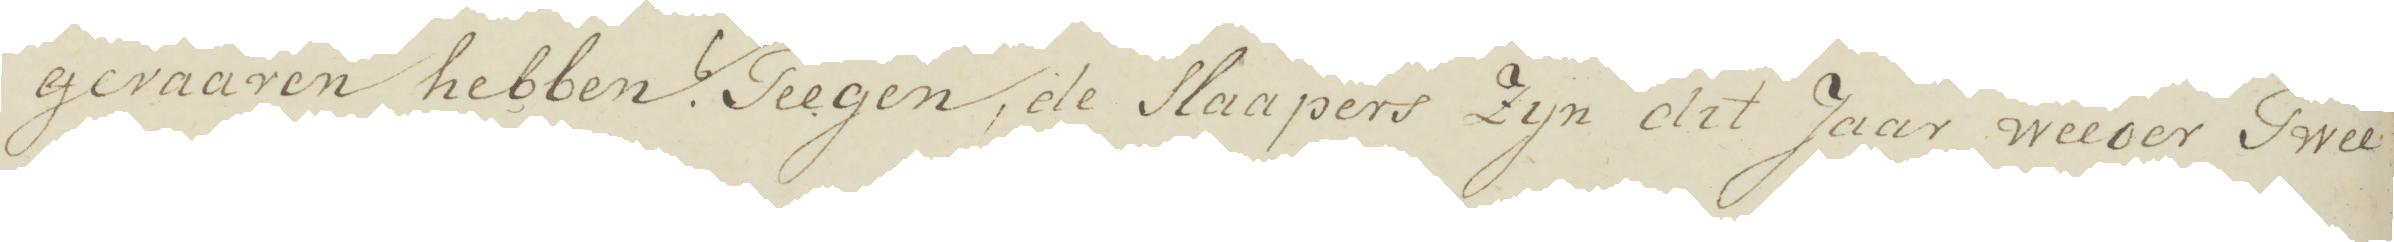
gevaaren hebben; Teegen, de Slaapers zyn dit Jaar weeder Twee
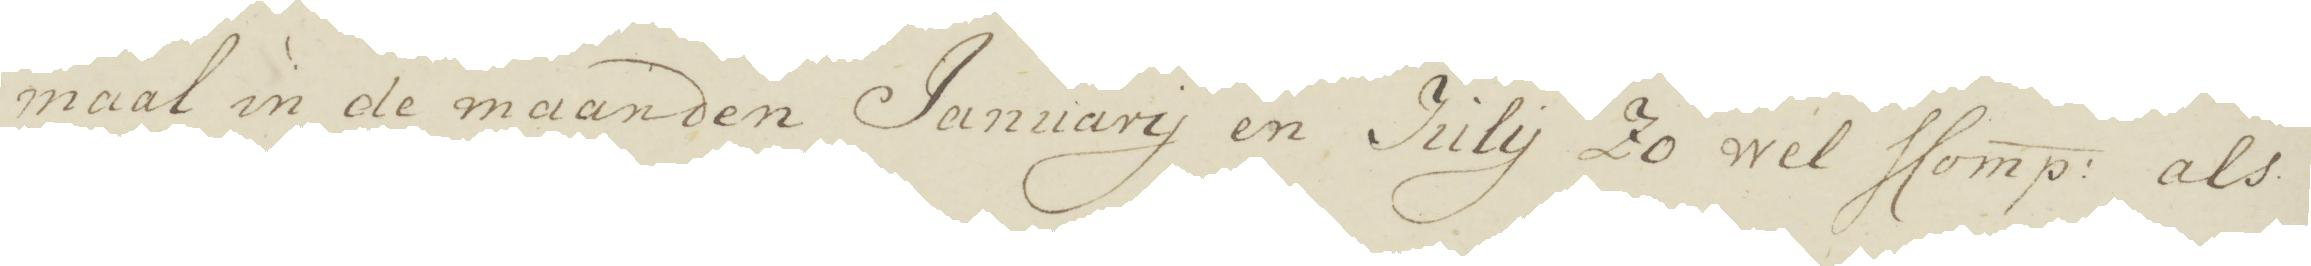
maal in de maanden Ianuarij en Iulij zo wel SComp: als
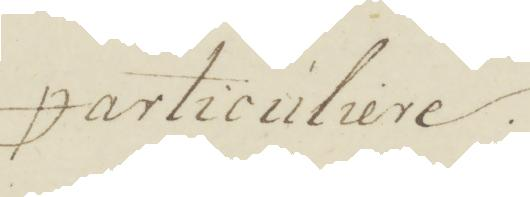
particuliere.
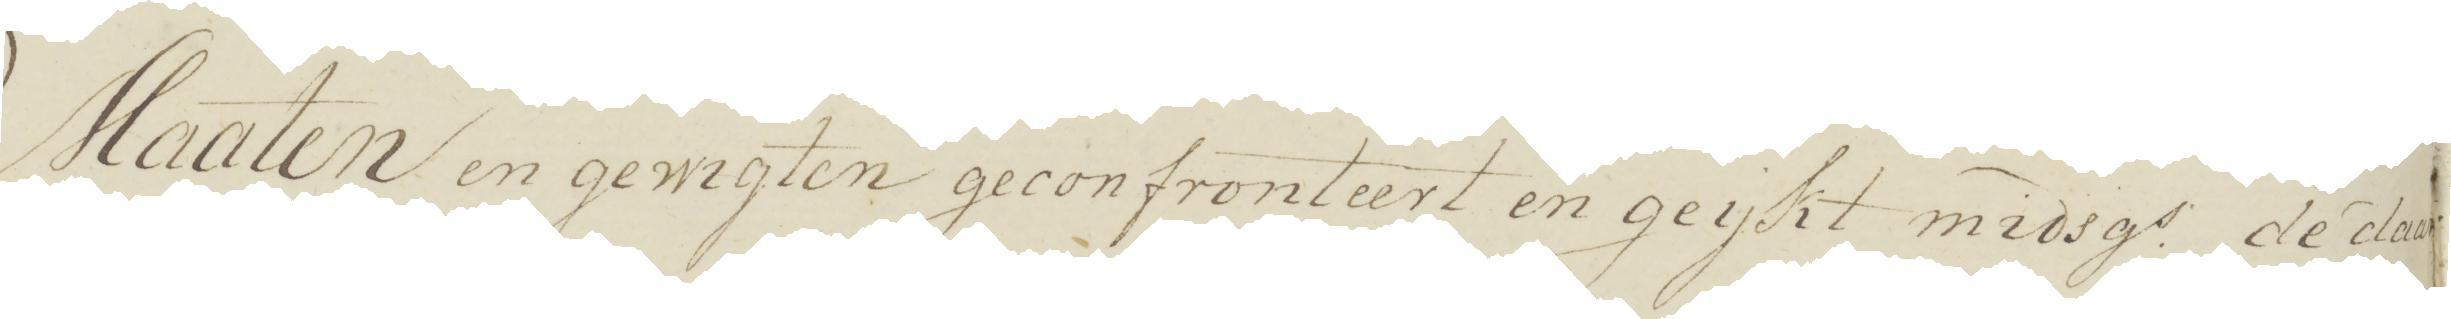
Maaten en gewigten geconfronteert en geijkt midsg:s de daar
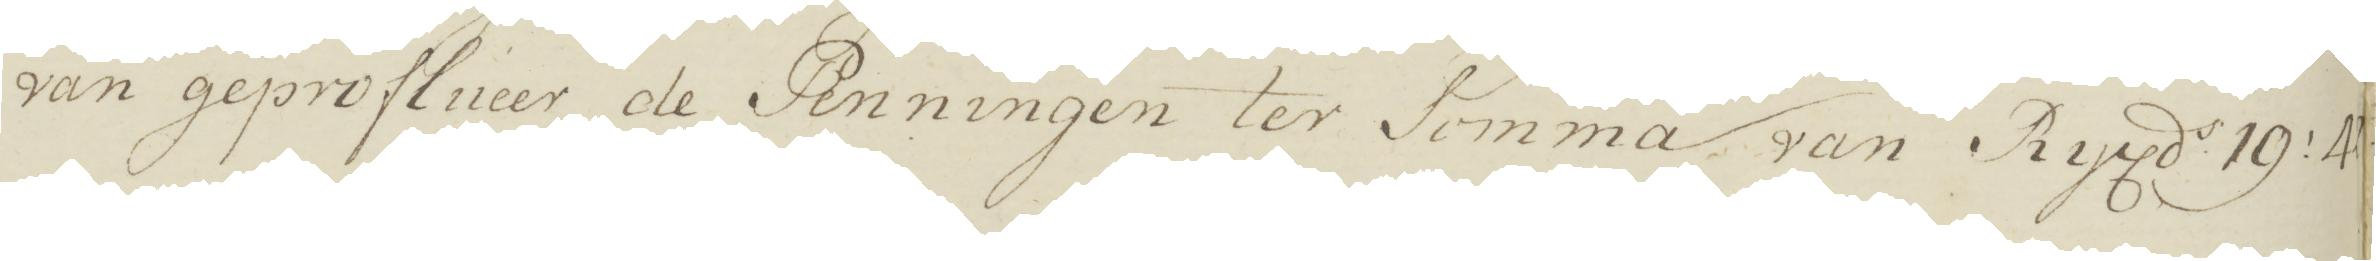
van geproflueer de Penningen ter somma van Ryxd:s 19:4:
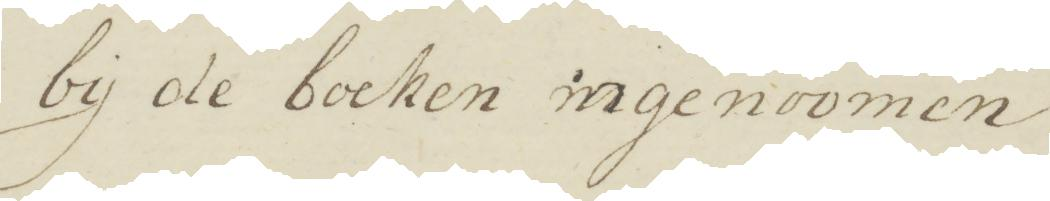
bij de boeken ingenoomen.
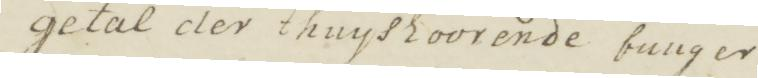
getal der thuyshoorende bunger
